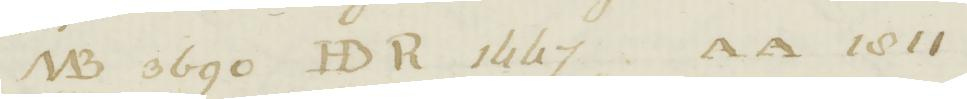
NB 3690 IDR 1447 AA 1811
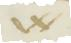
W
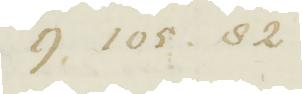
9. 105. 82
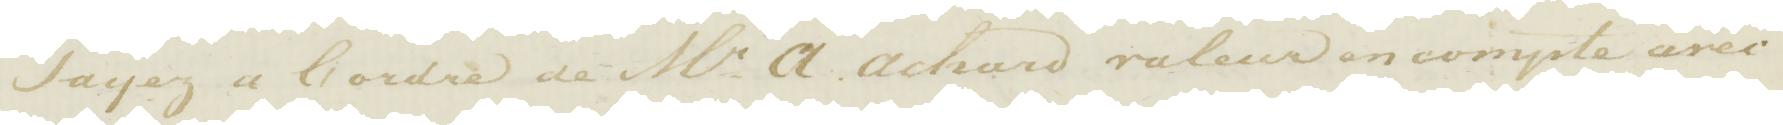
Payez a l' ordre de M=r A. Achard valeur en compte avec
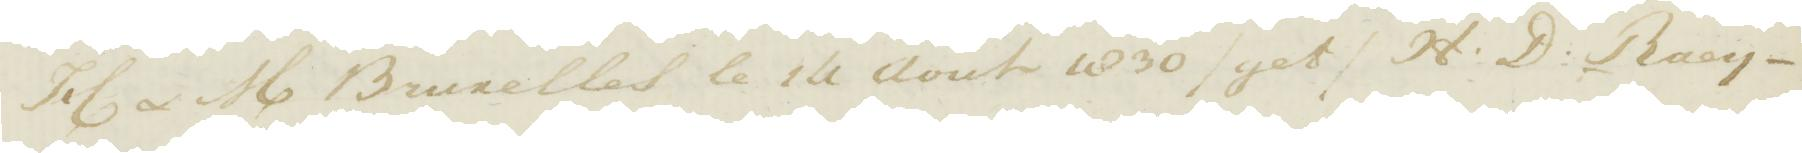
H & M Bruxelles le 14 dout 1830 /get/ H: D: Raeij–
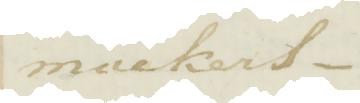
maekers–
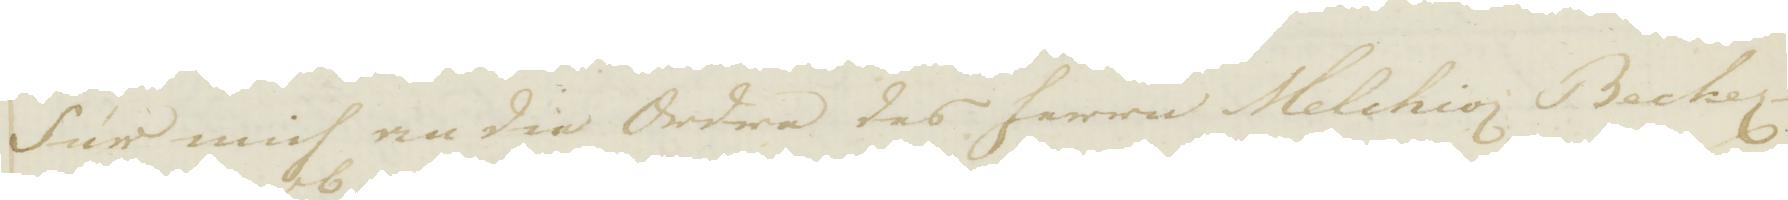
Fur mich an die Ordre das herrn Melchior Becker
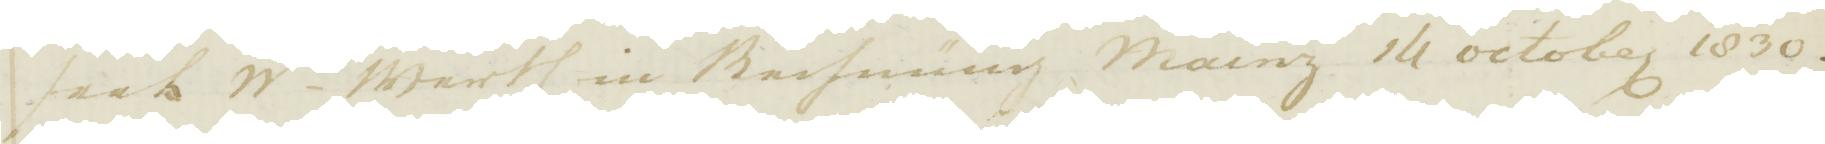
frak W-b Werth in Rechnung Mainz 14 october 1830
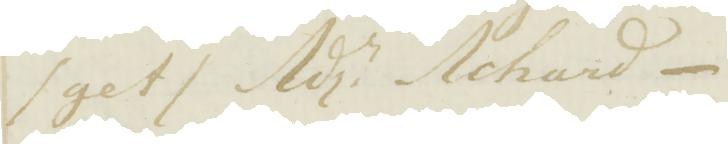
/get/ Ad:n Achard —
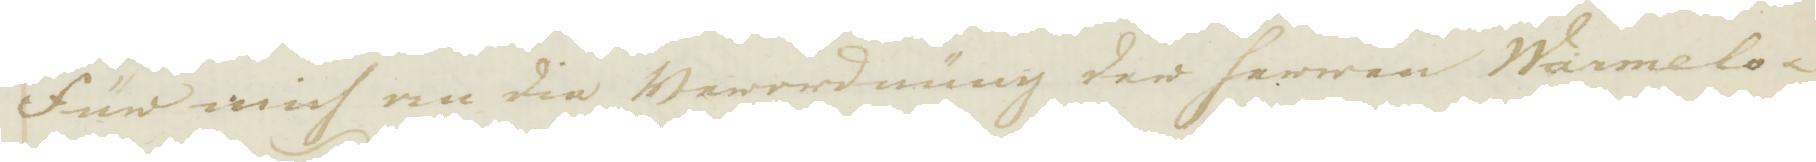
Für mich an die Verordnüng der herren Warmelo &
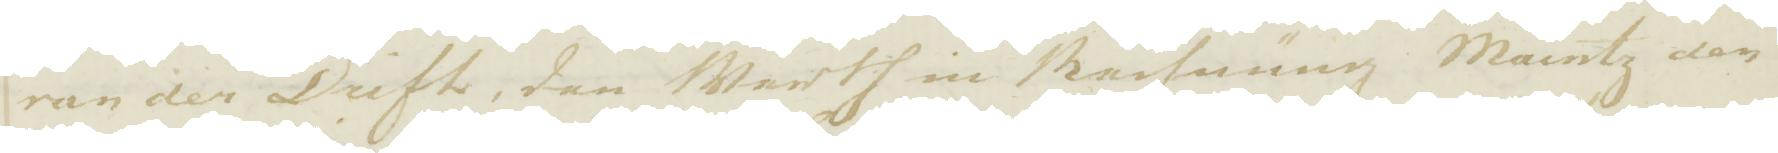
van der Drift, der Werth Rechnüng Maintz den
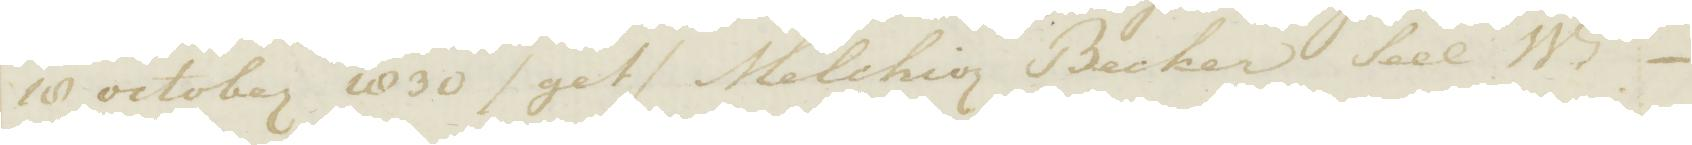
18 october 1830 /get/ Melchior Becker seel Wr —
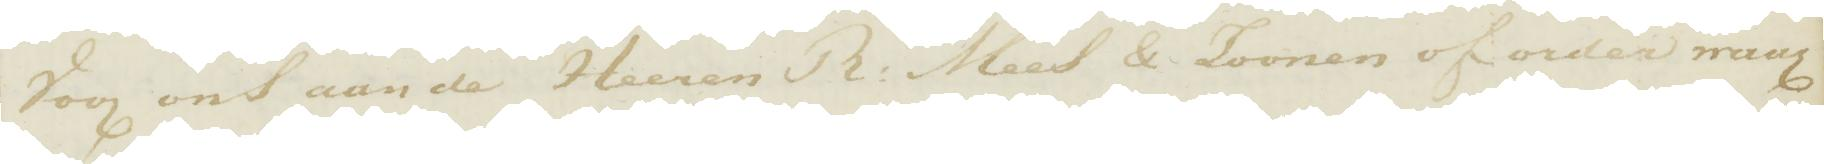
Voor ons aan de Heeren R: Mees & Loonen of order waar
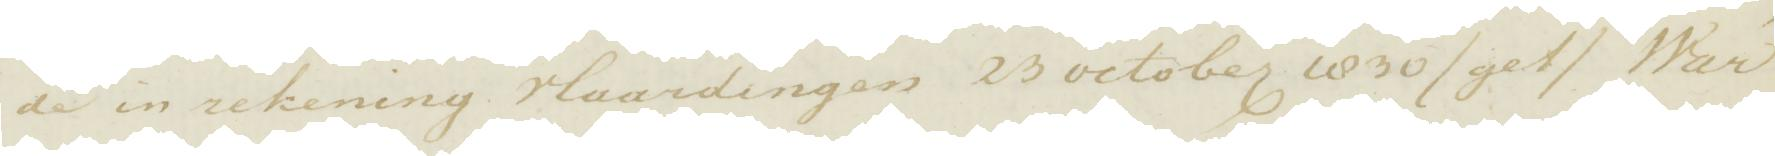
de in rekening Vlaardingen 23 october 1830 /get/ War
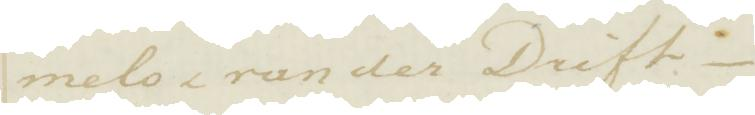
melo van der Drift
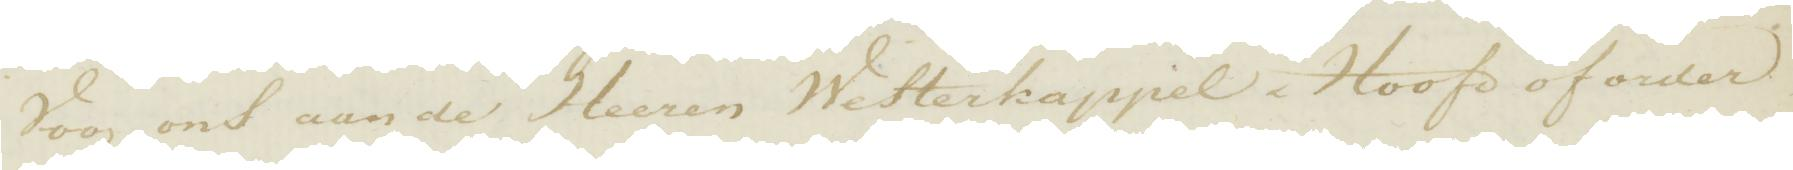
Voor ons aan de Heeren Westerkappel Hoofd of order
